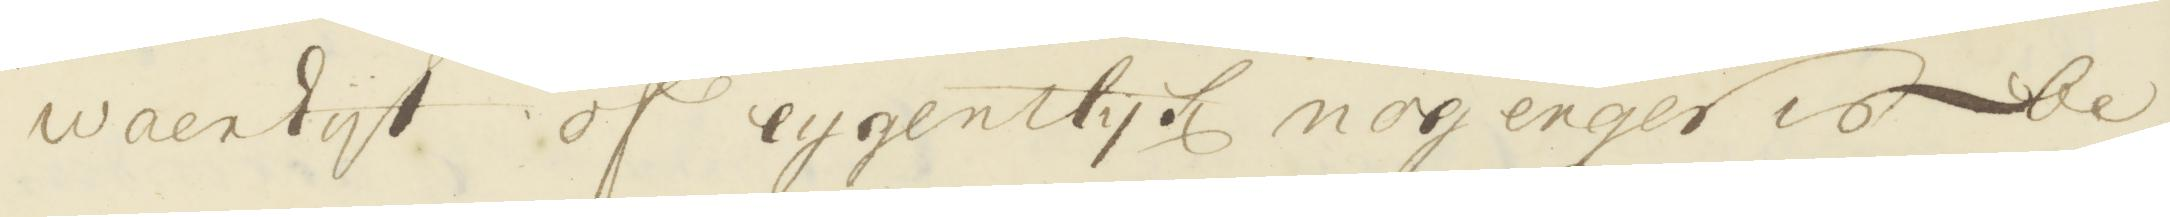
waerhijt of eygentlijk nog erger is be
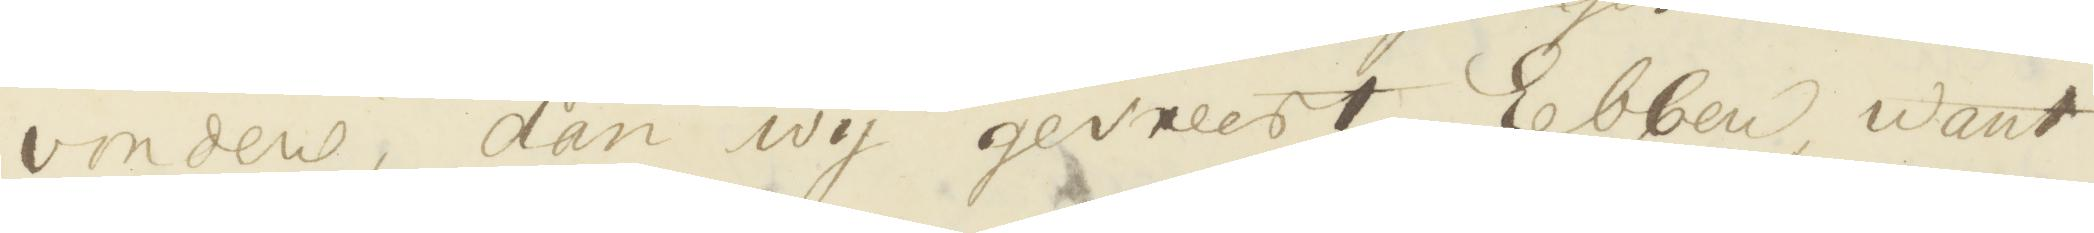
vonden, dan wy gevreest hebben want
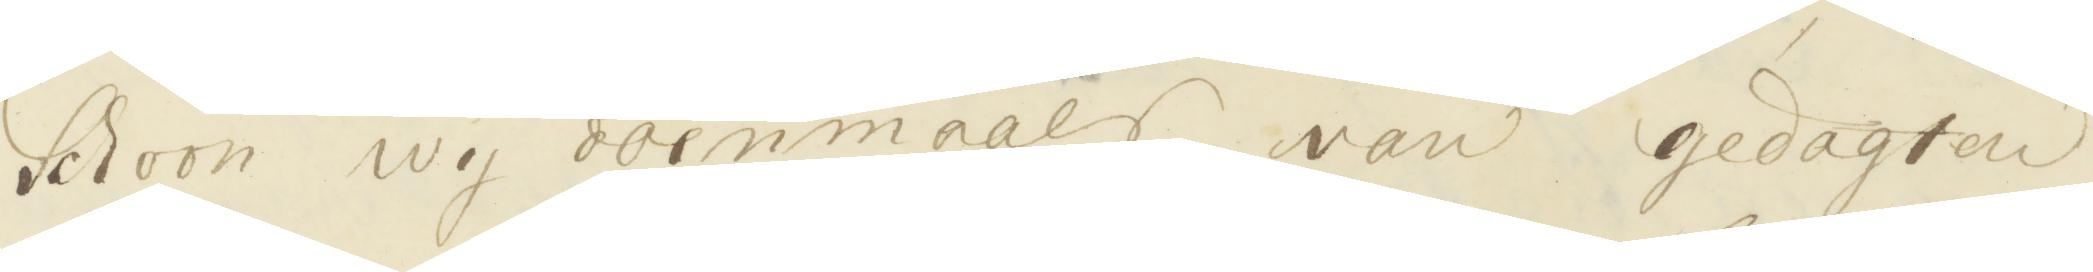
schoon wy doenmaals van gedagten
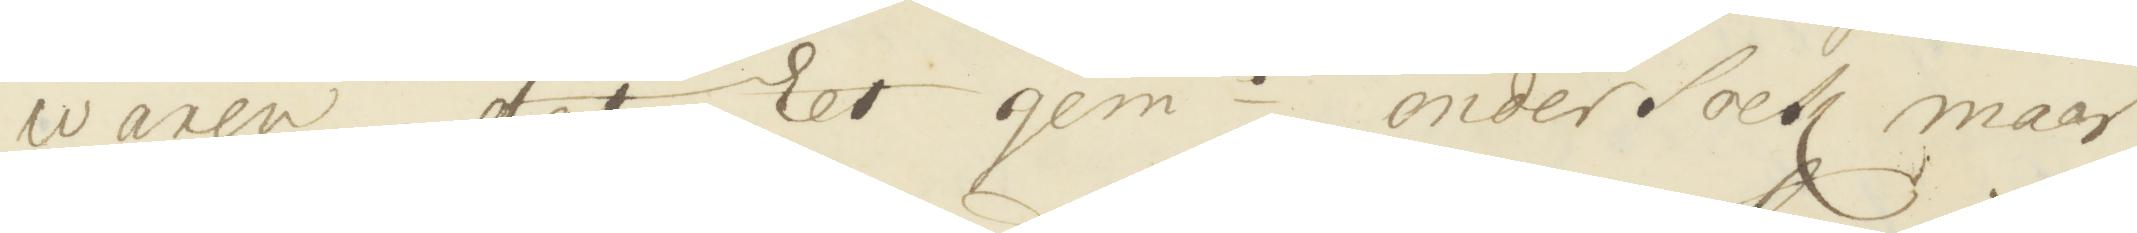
waren dat het gem=e ondersoek maar
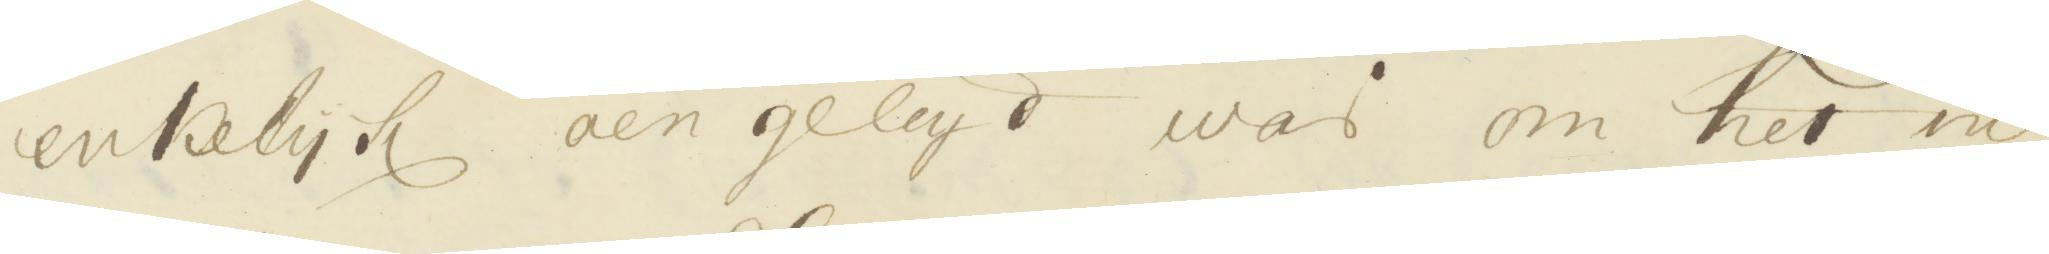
enkelijk aen geleyd was om het in
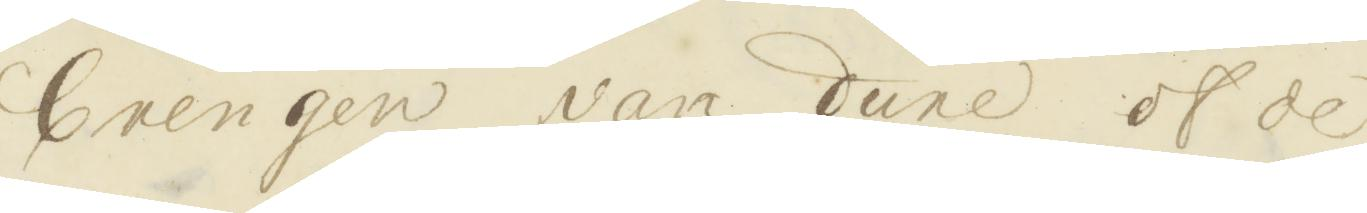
reekening brengen van dure of de
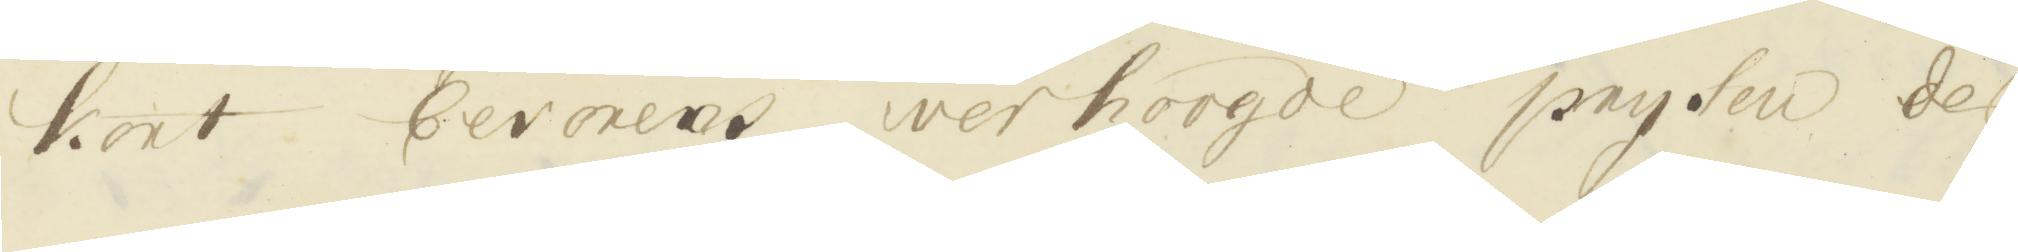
kort bevorens verhoogde prysen des
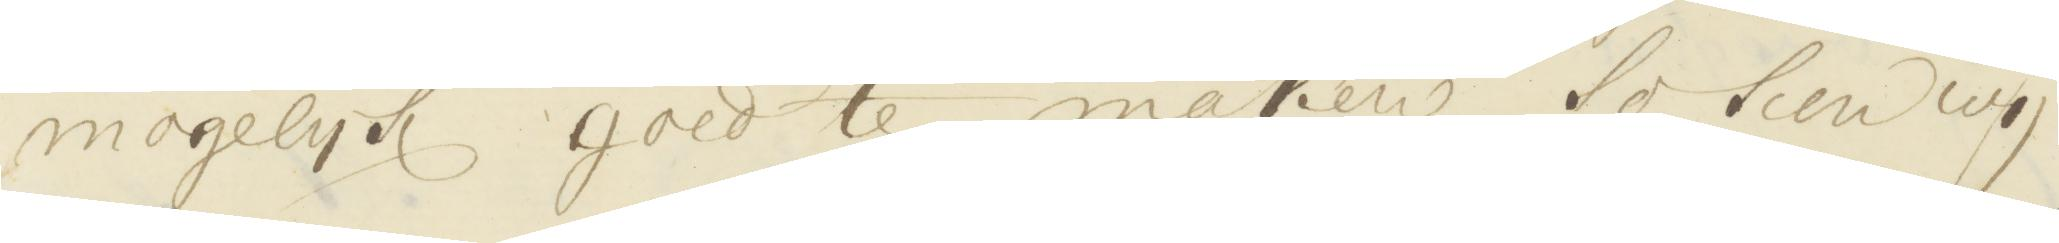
mogelijk goed te maken, So Sien wij
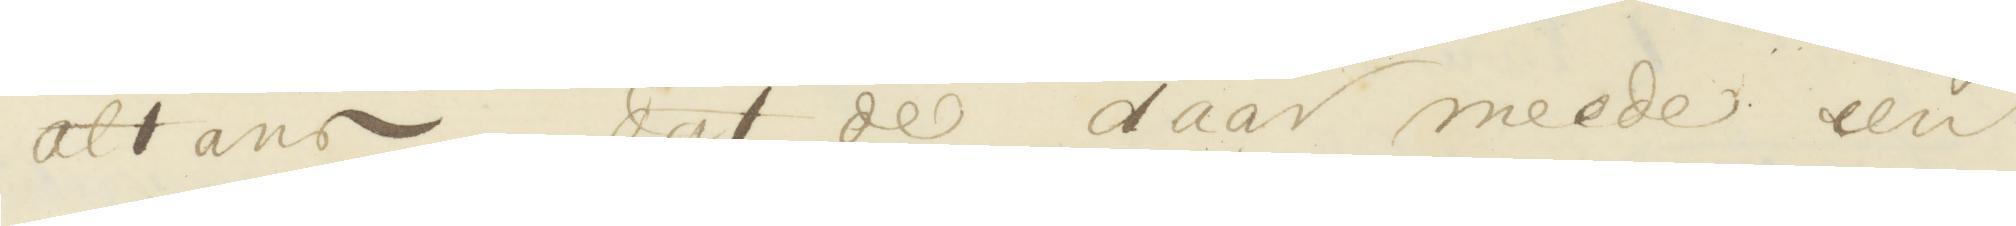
altans dat de daarmeede een
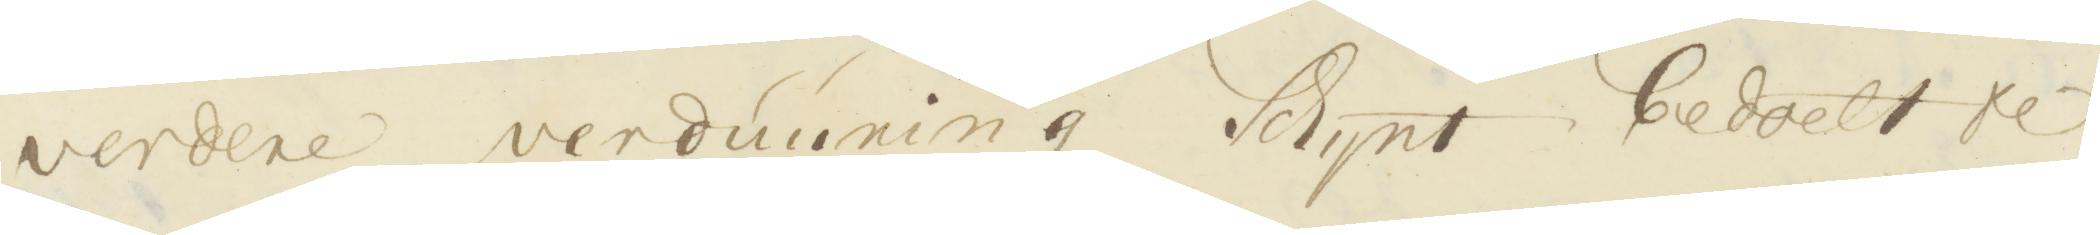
verdere verduuring Schynt bedoelt te
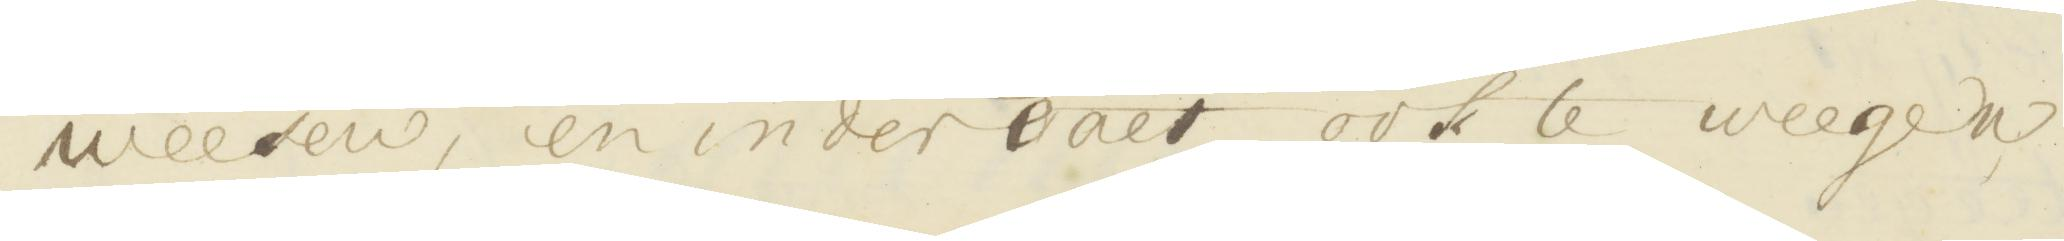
weesen, en inderdaet ook te weegen,
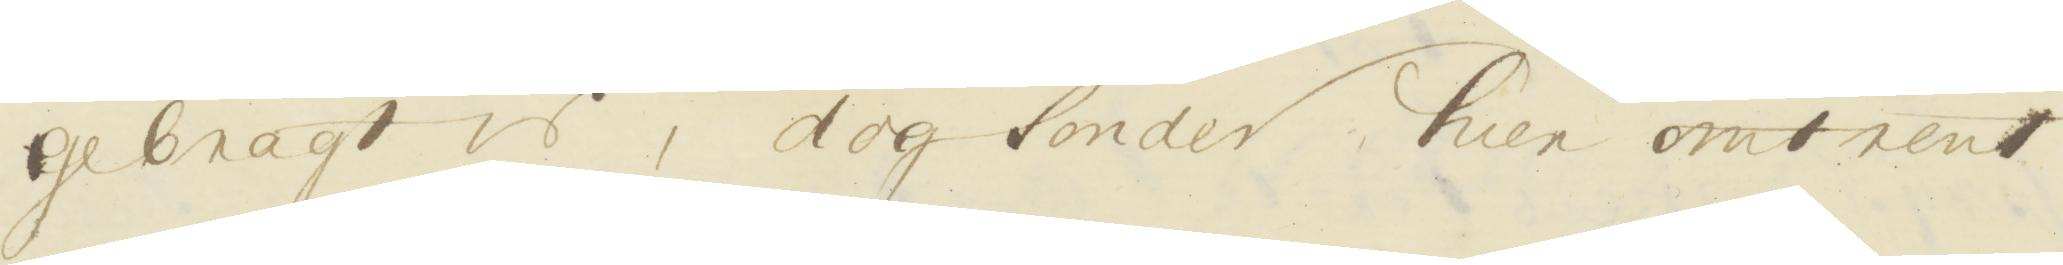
gebragt is, dog sonder hier omtrent
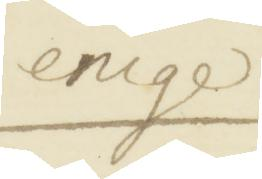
enige
